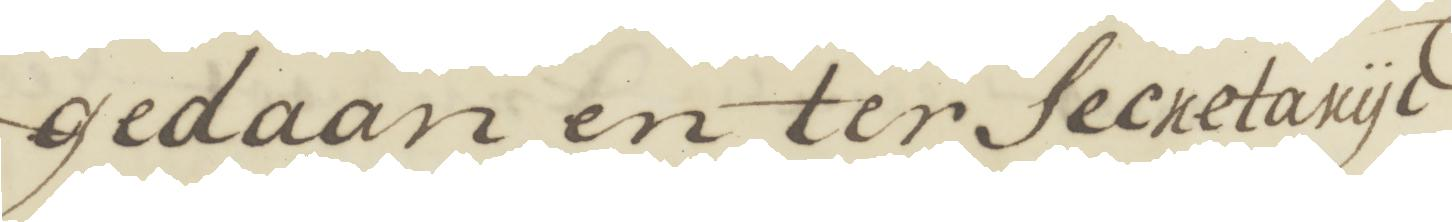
gedaan en ter Secretarije
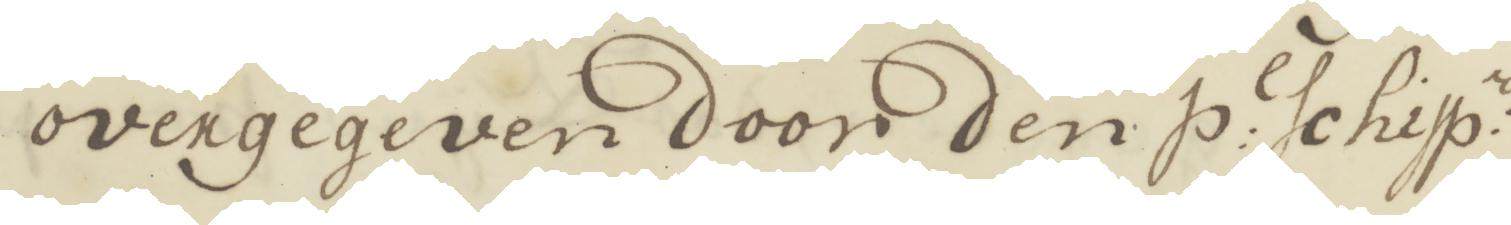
overgegeven door den p:l schipp:r
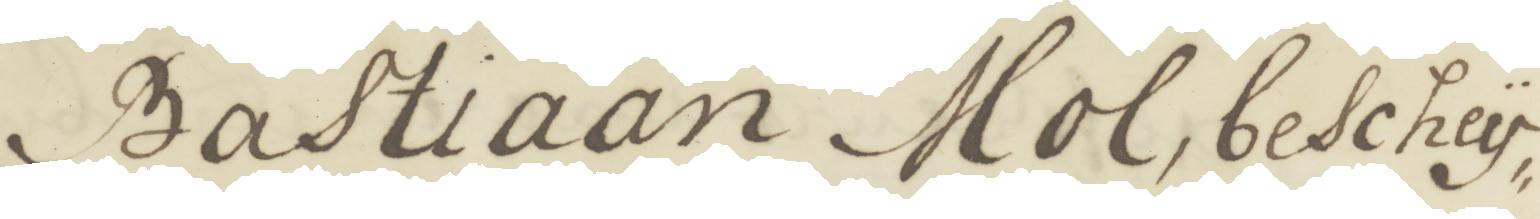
Bastiaan Mol, bescheij„
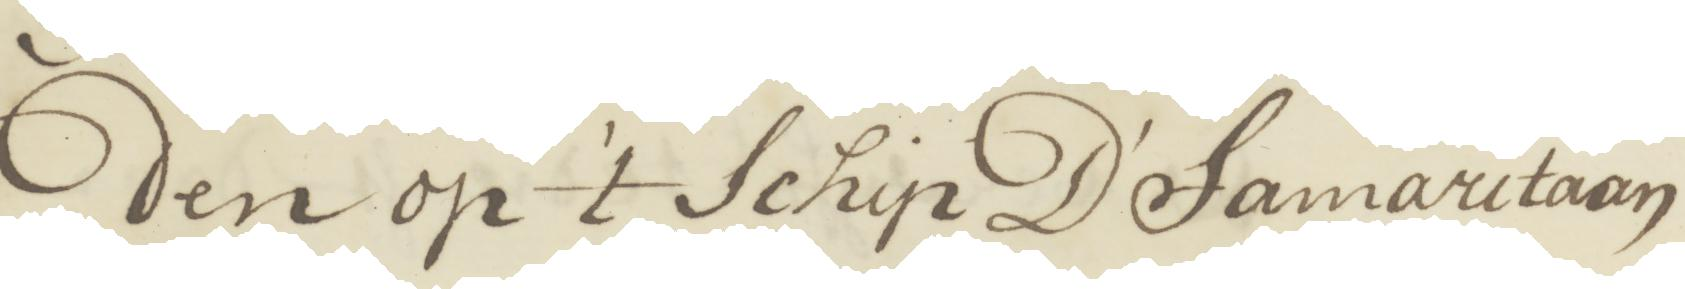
den op ’t schip D' Samaritaan
